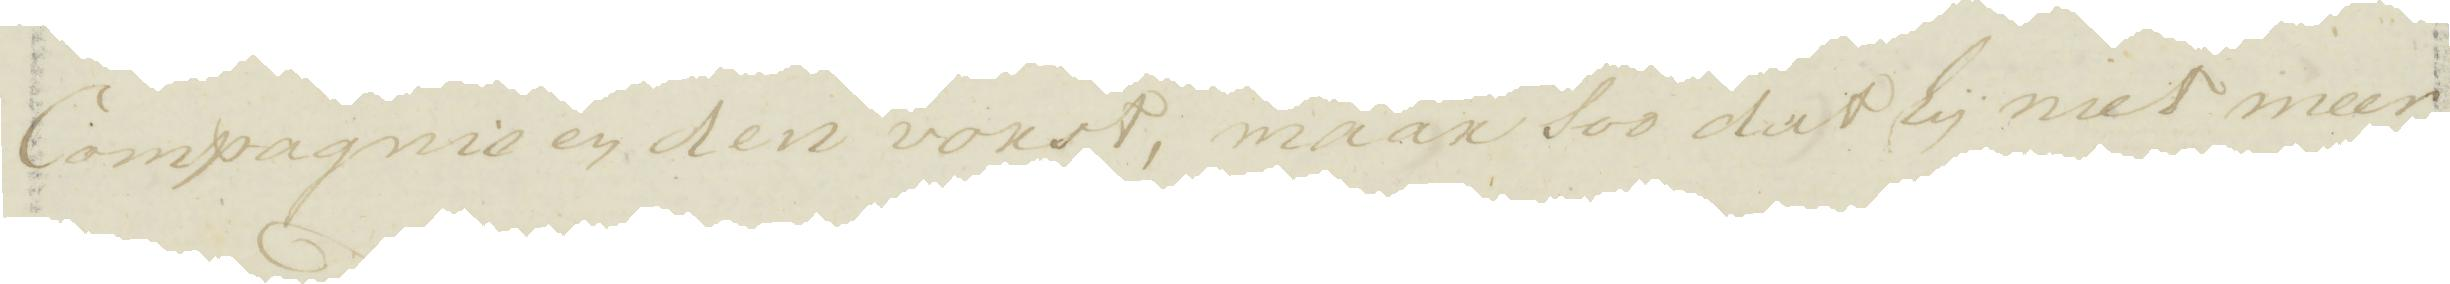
Compagnie en den vorst, maar soo dat hij niet meer
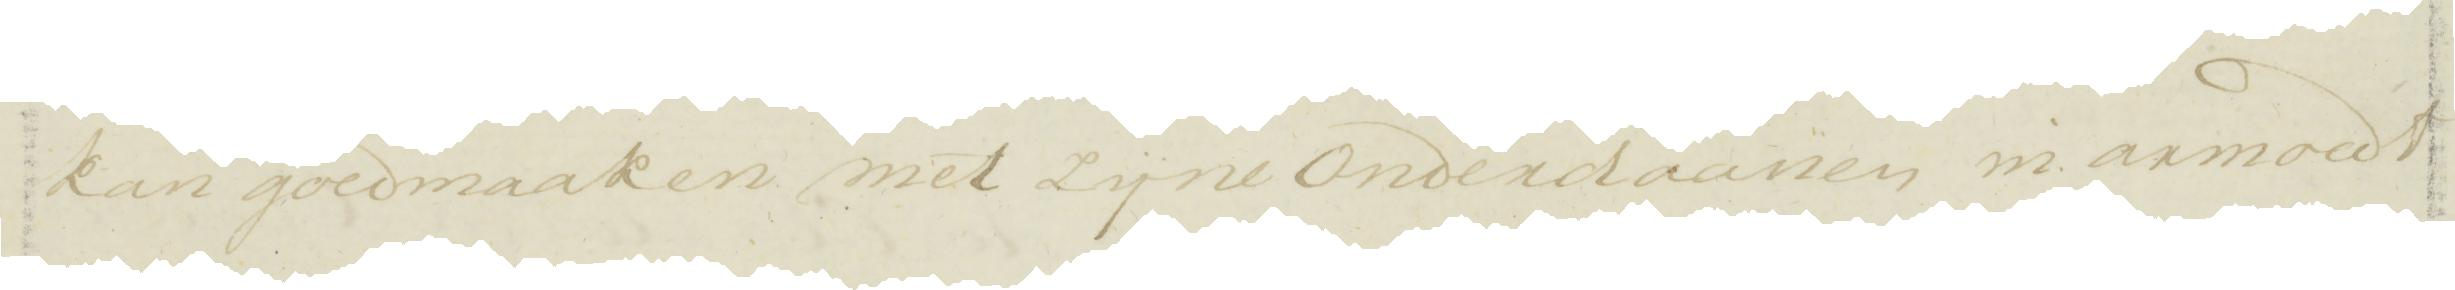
kan goedmaaken met zijne onderdaanen in armoedt
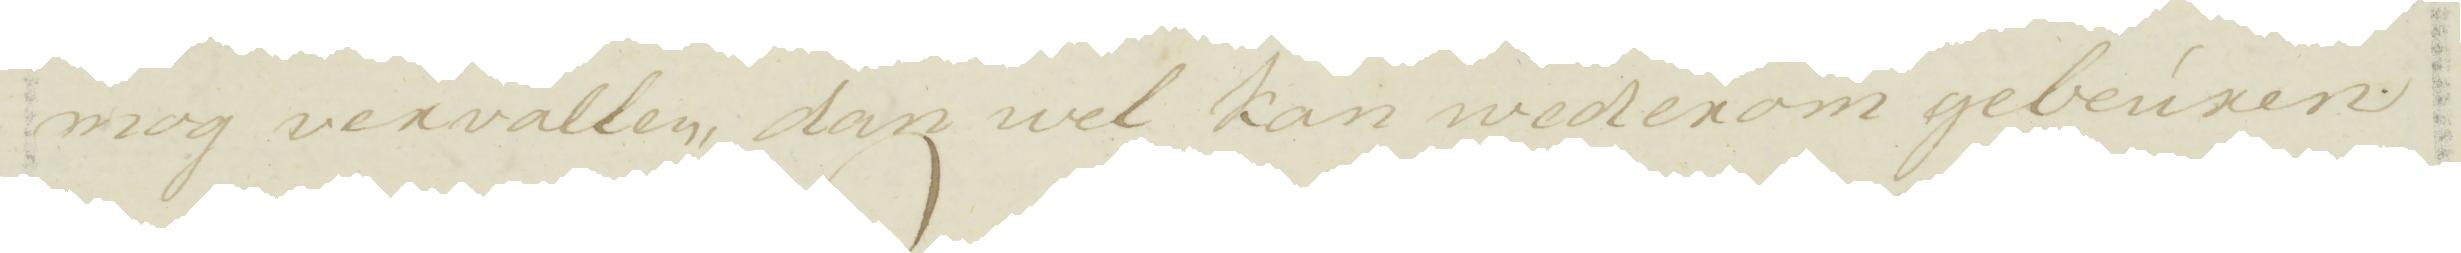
mog vervallen, dan wel kan wederom gebeuren
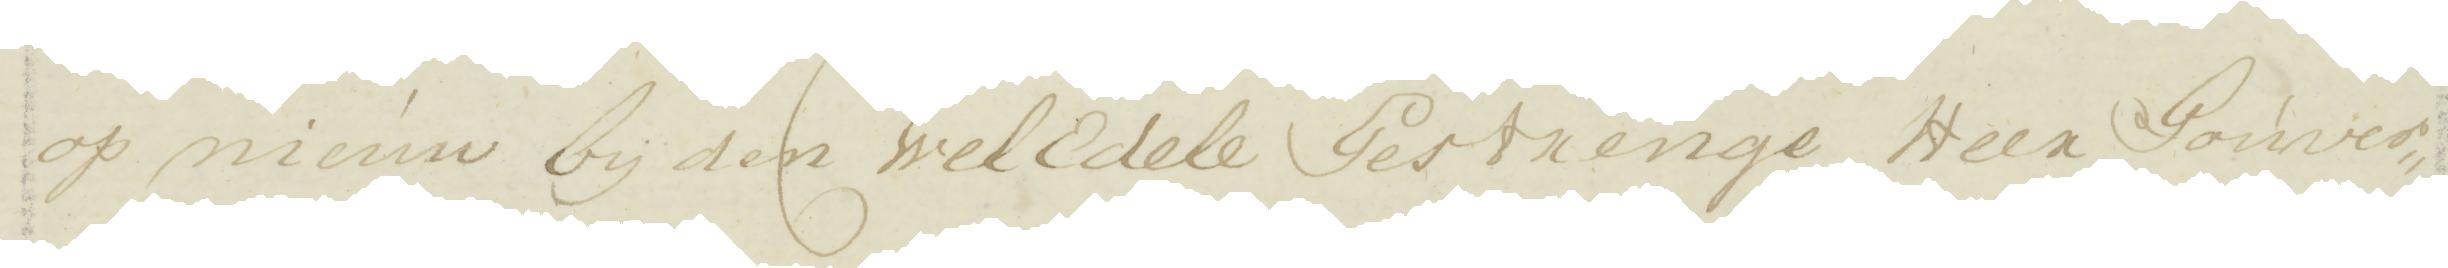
op nieuw bij den wel Edele Gestrenge Heer Gouver„
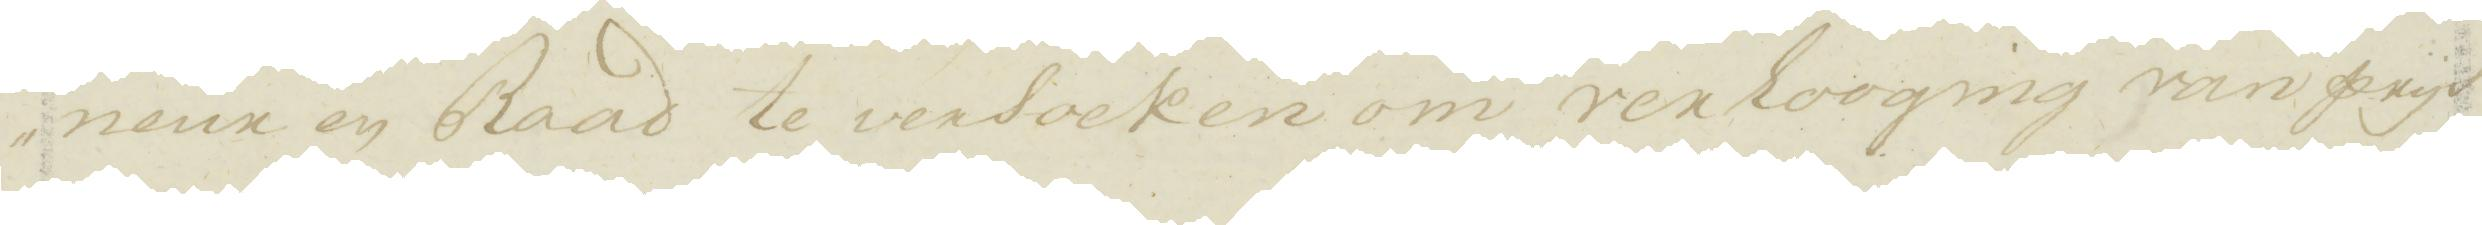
„neur en Raad te versoeken om verhooging van prijs
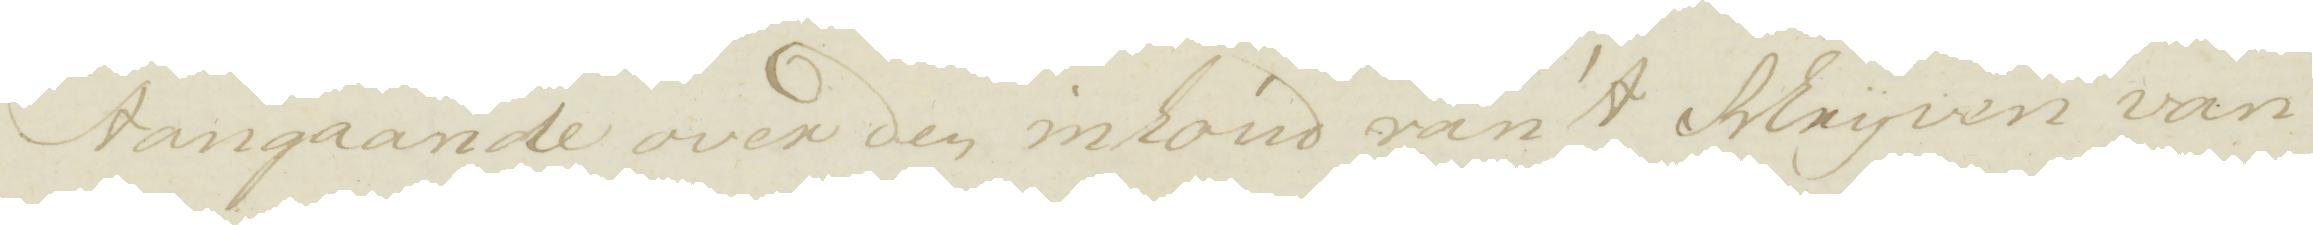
Aangaande over den inhoud van ’t schrijven van
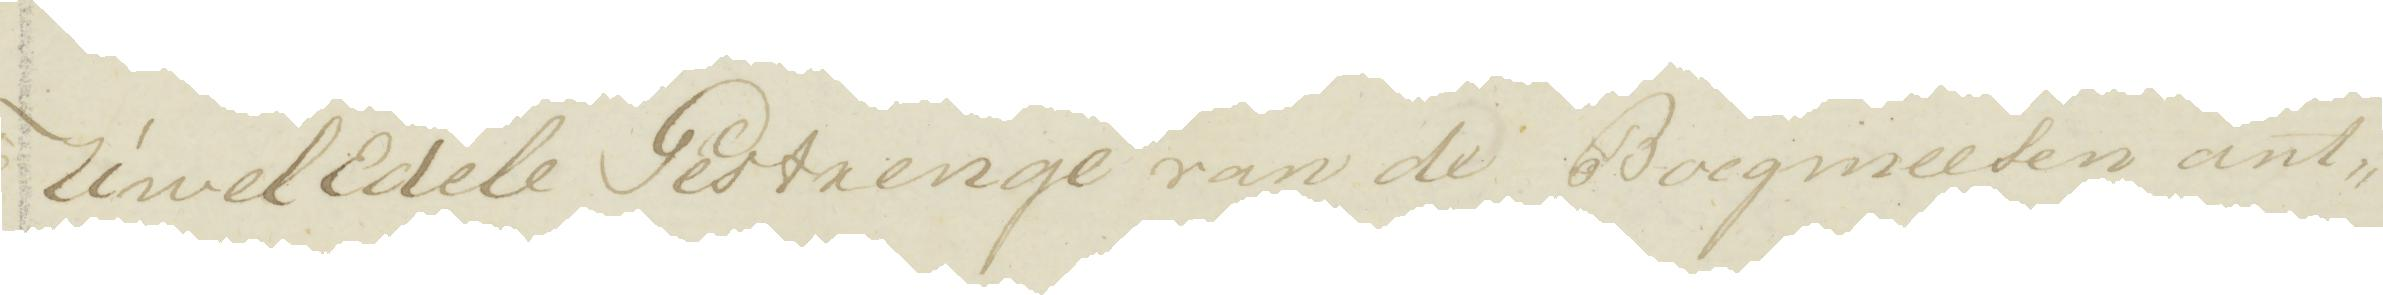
Uwel Edele Gestrenge van de Boegineesen ant„
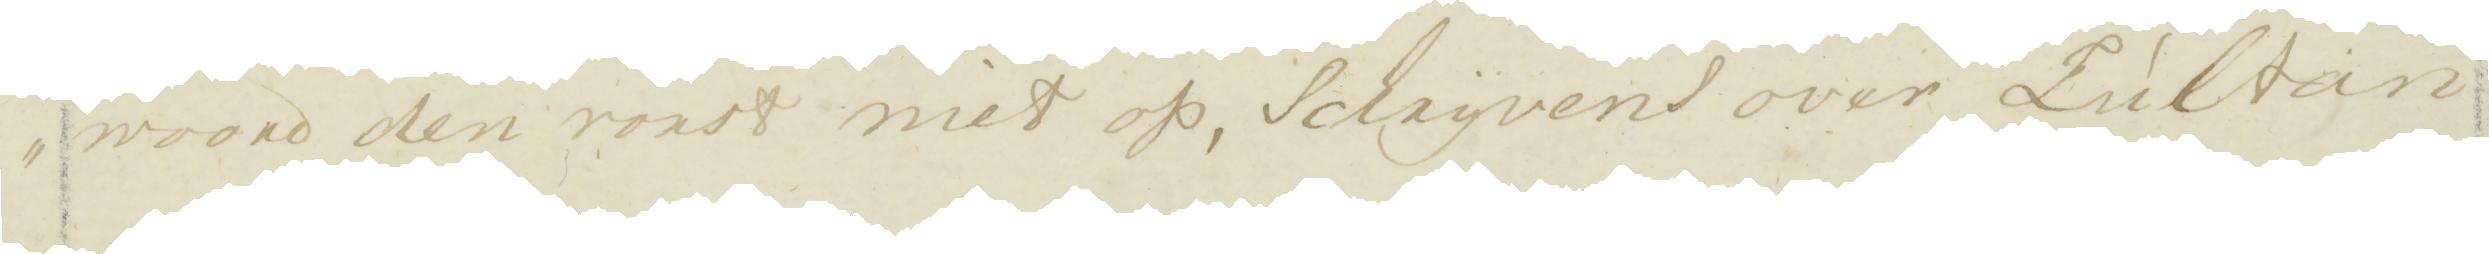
„woord den vorst met op, schrijvens over Zultan
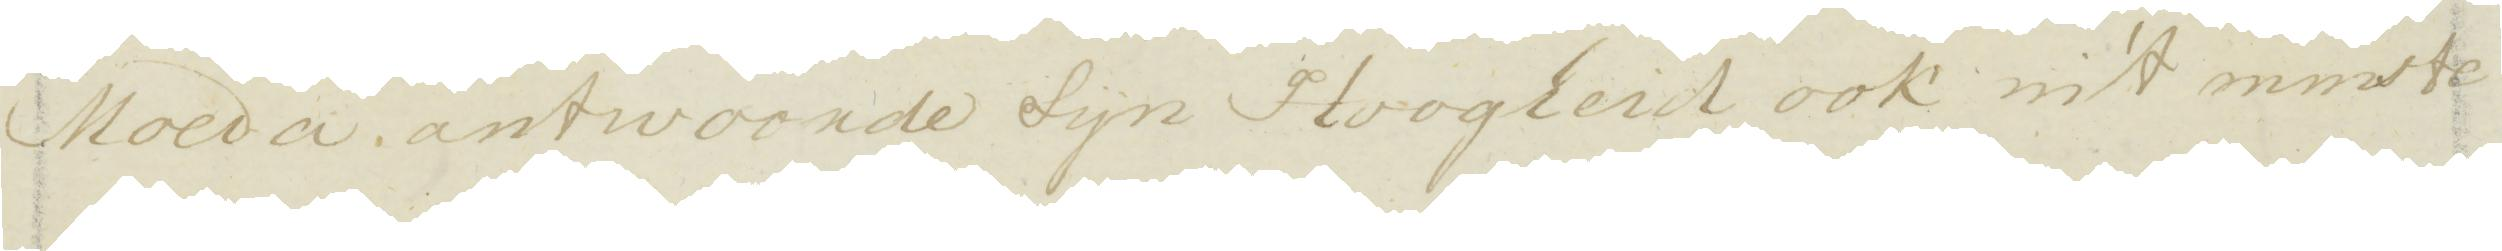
Moeda, antwoorde sijn Hoogheijt ook in't minste
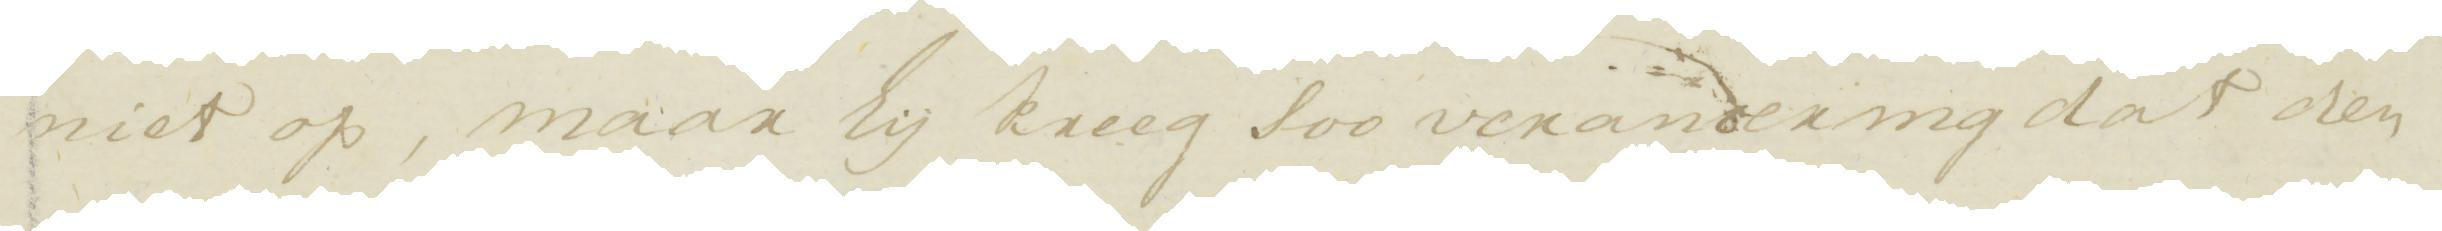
niet op, maar hij kreeg soo verandering dat den
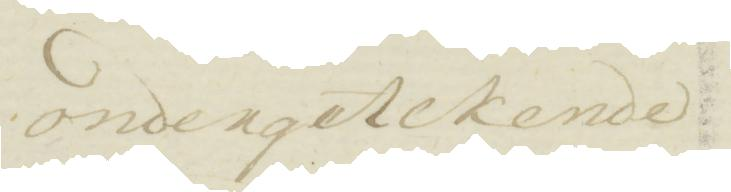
ondergetekende
